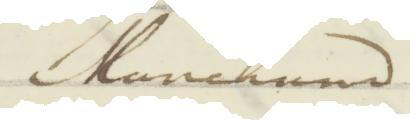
Marchand
